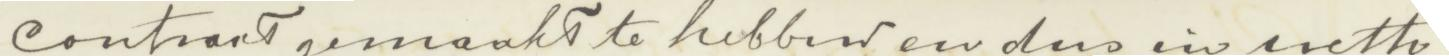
contract gemaakt te hebben en dus in wette
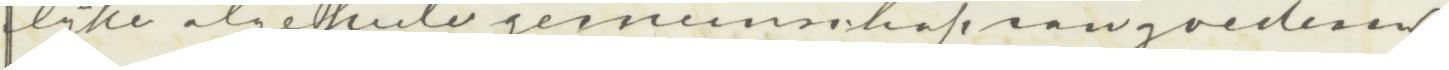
lijke algeheele gemeenschap van goederen
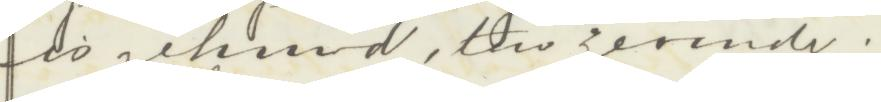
is gehuwd, ten zevende;
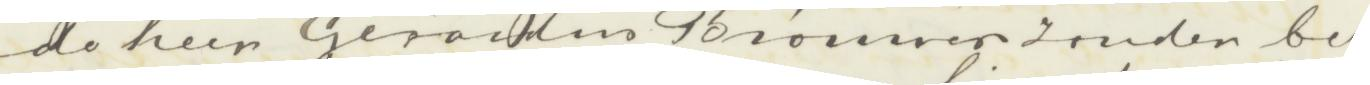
de heer Gerardus Brouwer zonder be
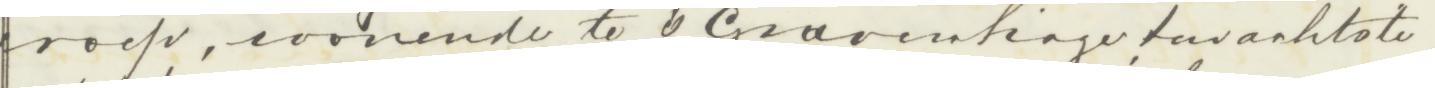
roep, wonende te 's Gravenhage, ten achtste
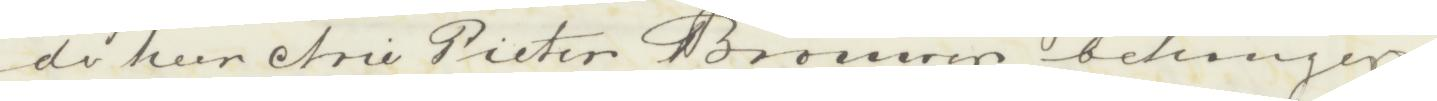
de heer Arie Pieter Brouwer, behanger
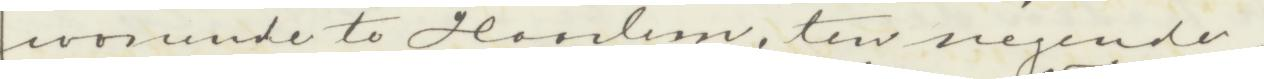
wonende te Haarlem, ten negende
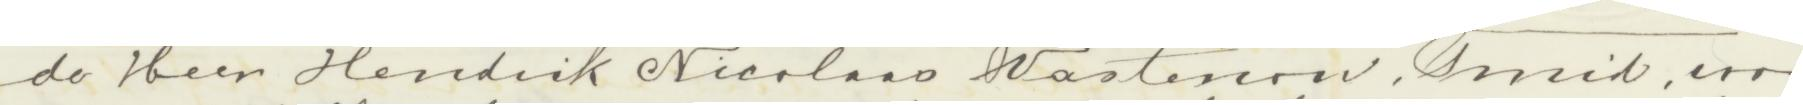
de Heer Hendrik Nicolaas Vastenou, smid, wo
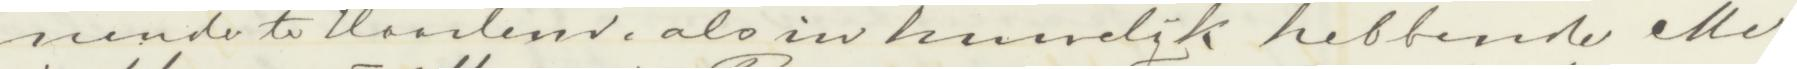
nende te Haarlem, als in huwelijk hebbende Me
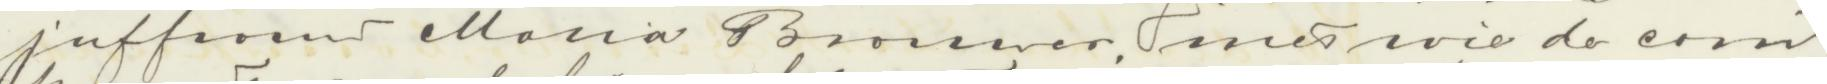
juffrouw Maria Brouwer, met wie de com
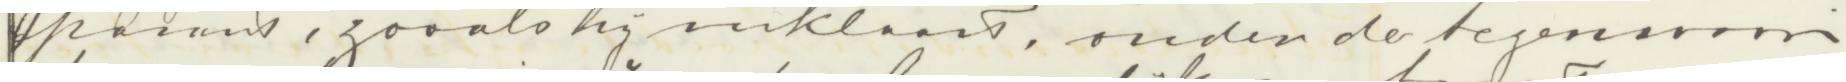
parant, zooals hij verklaard, onder de tegenwoor
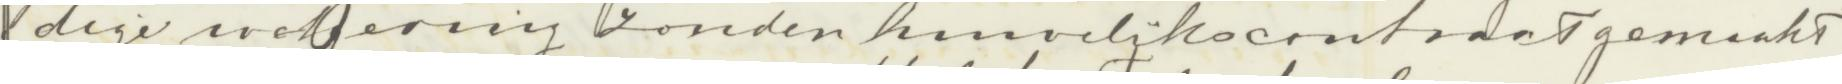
dige wetgeving zonder huwelijkscontact gemaakt
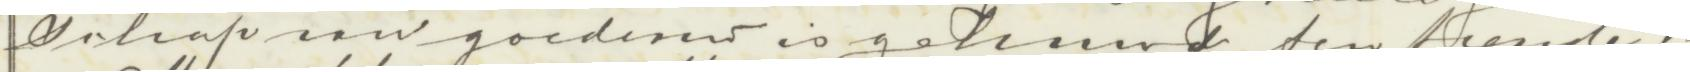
schap van goederen is gehuwd, ten tiende,
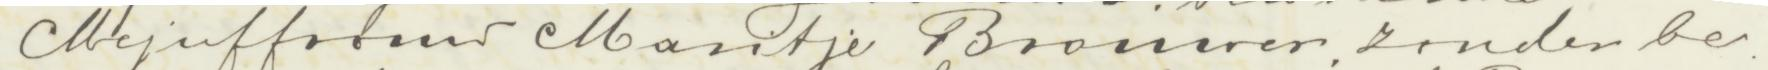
Mejuffrouw Maritje Brouwer, zonder be.
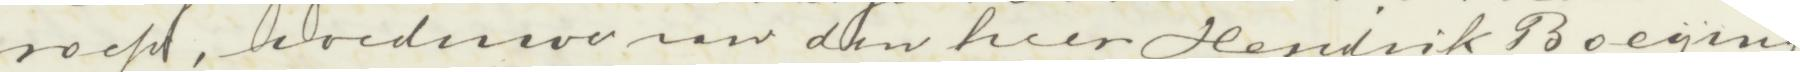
roep, weduwe van der heer Hendrik Boeijing
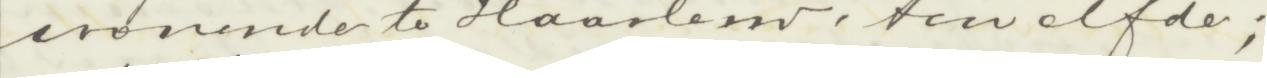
wonende te Haarlem, ten elfde;
